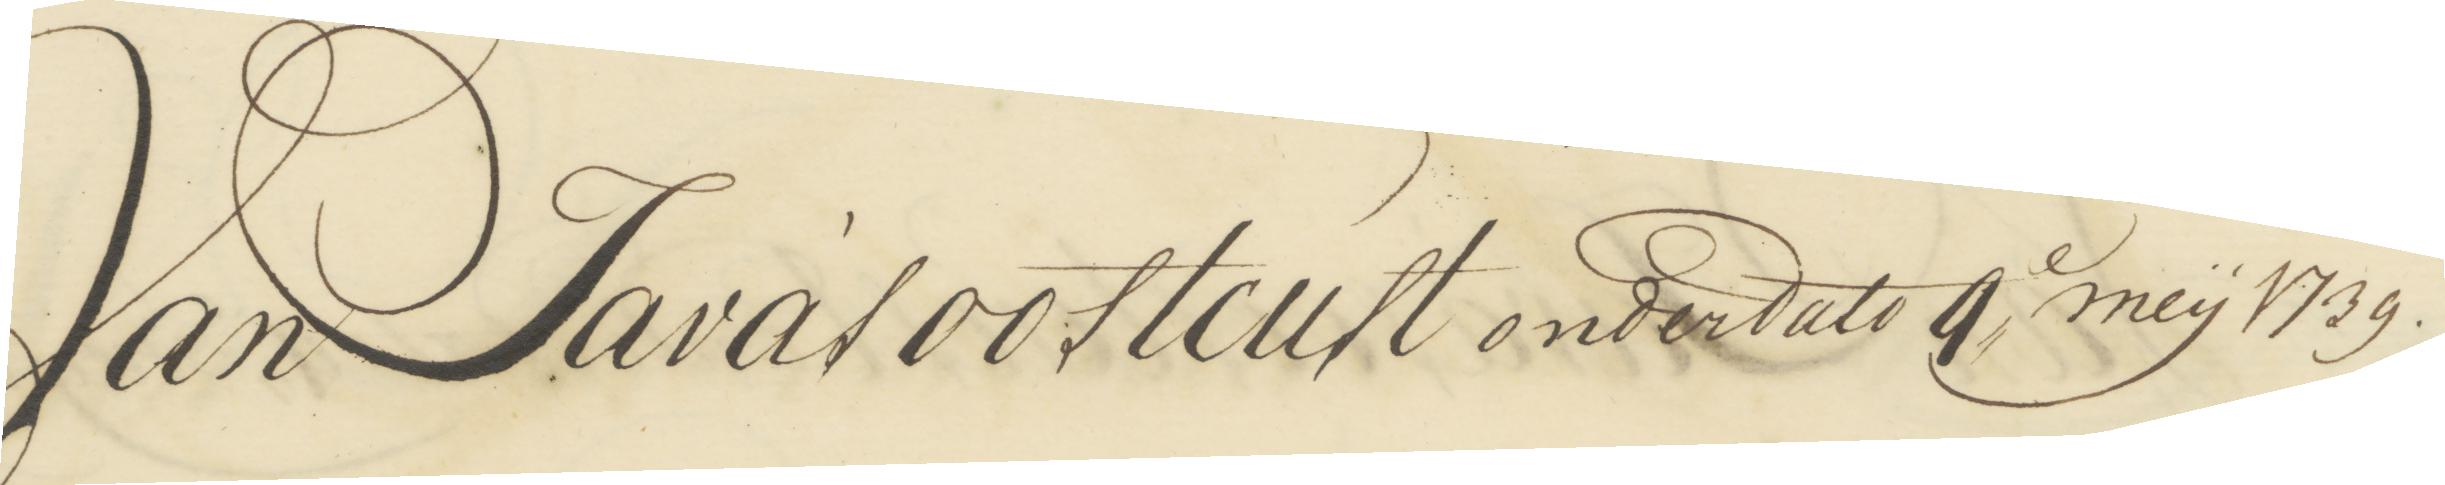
Van Iava's oostcust onder dato 4„e meij 1739.
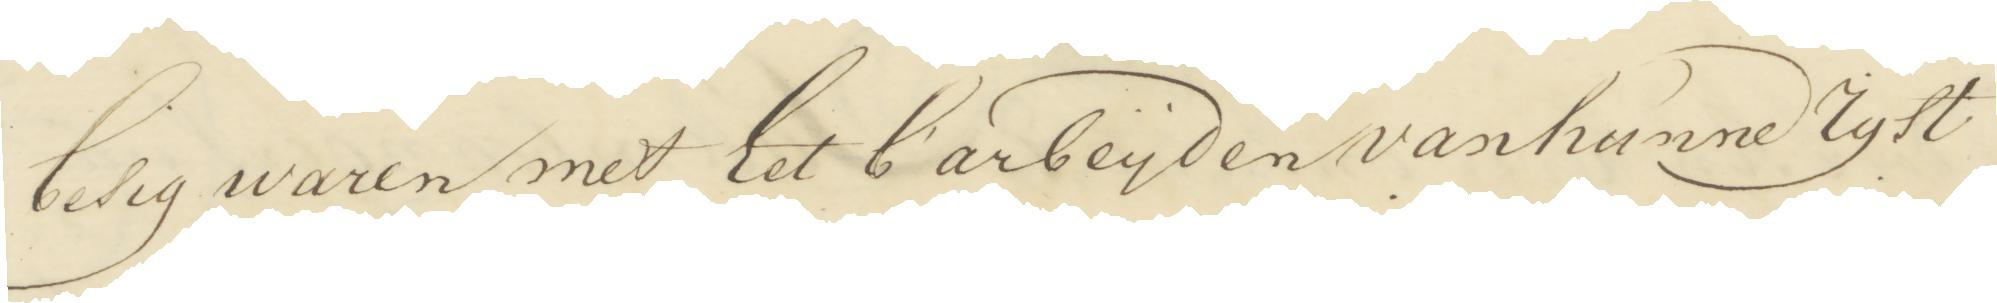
besig waren met het b'arbeijden van hunne rijst
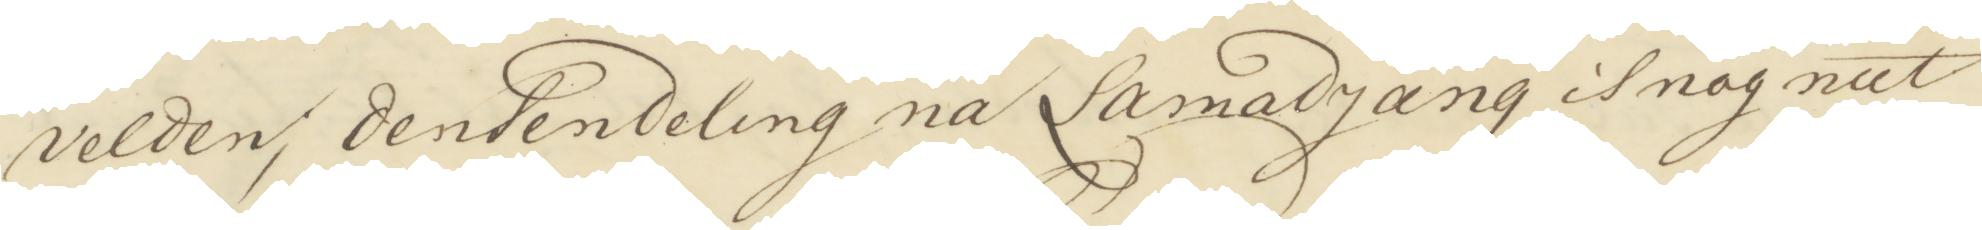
velden, densendeling na Samadjang is nog niet
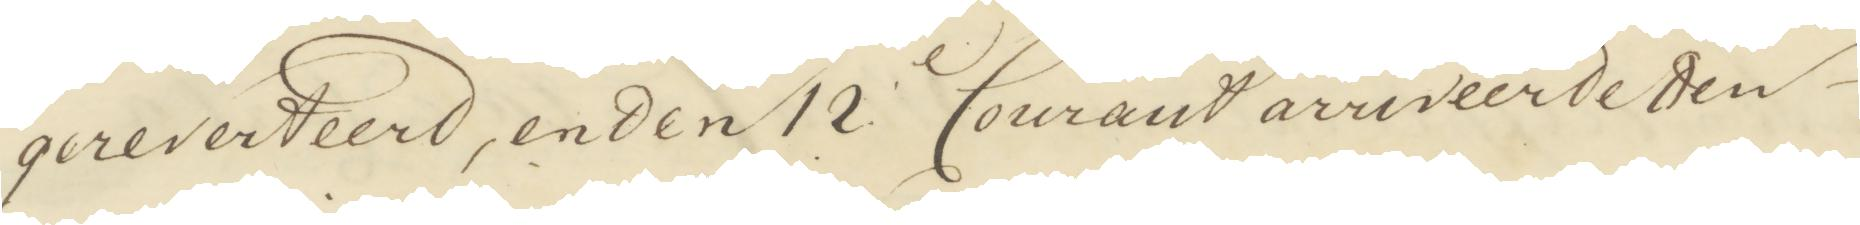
gereverteerd, en den 12:e Courant arriveerde den
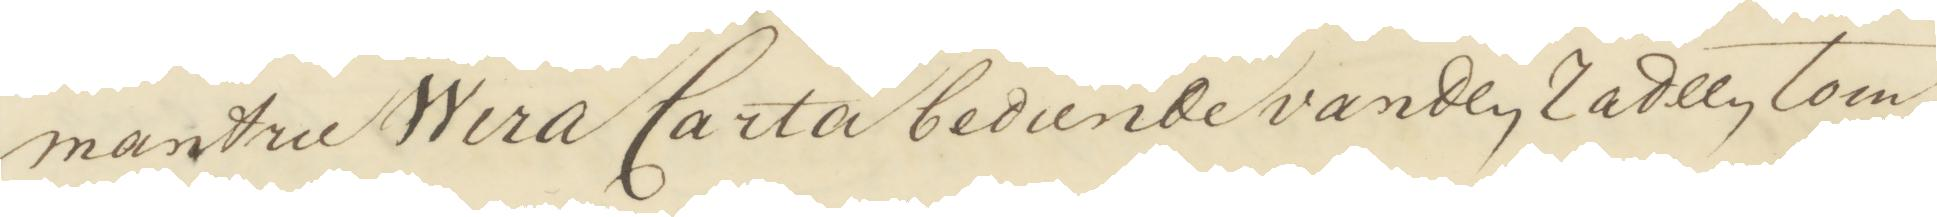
mantrie Wira Carta bediende vanden radeen tom
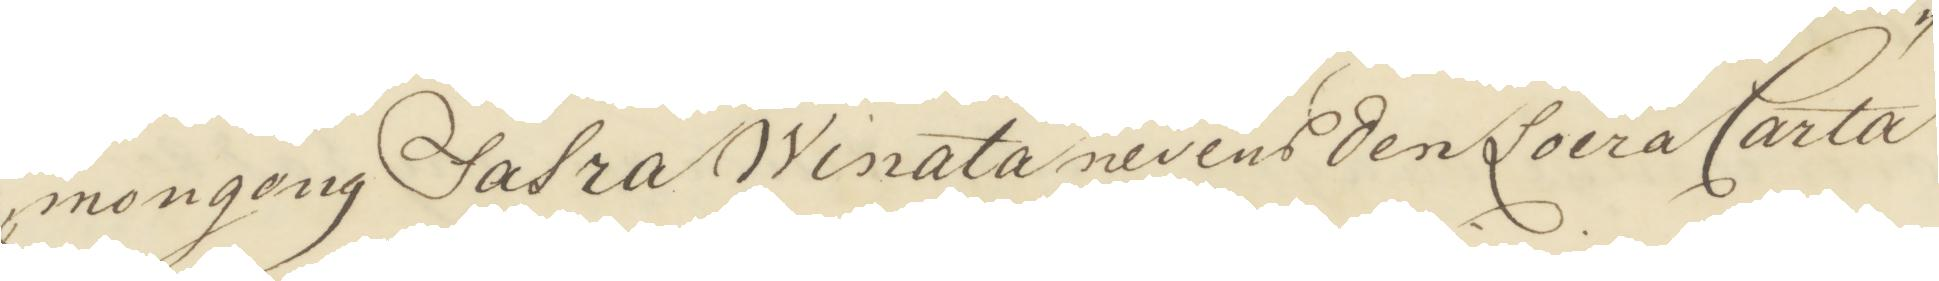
„mongong Sasra Winata nevens den Soera Carta
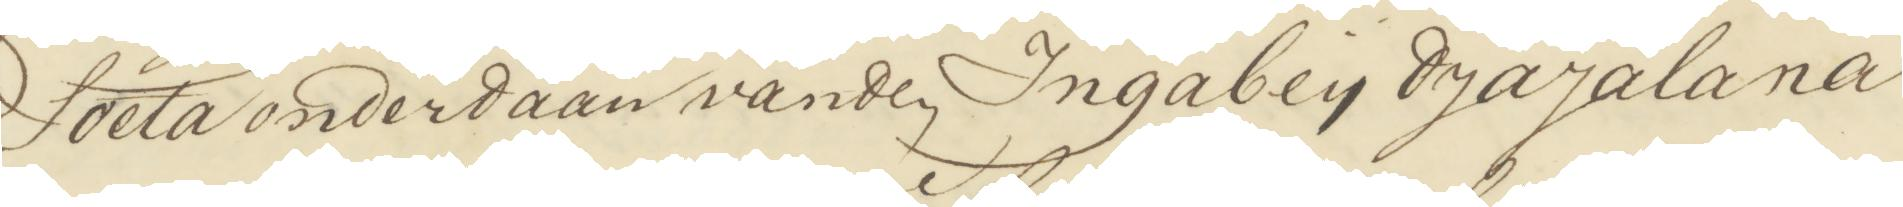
Soeta onderdaan vanden Ingabeij djajalana
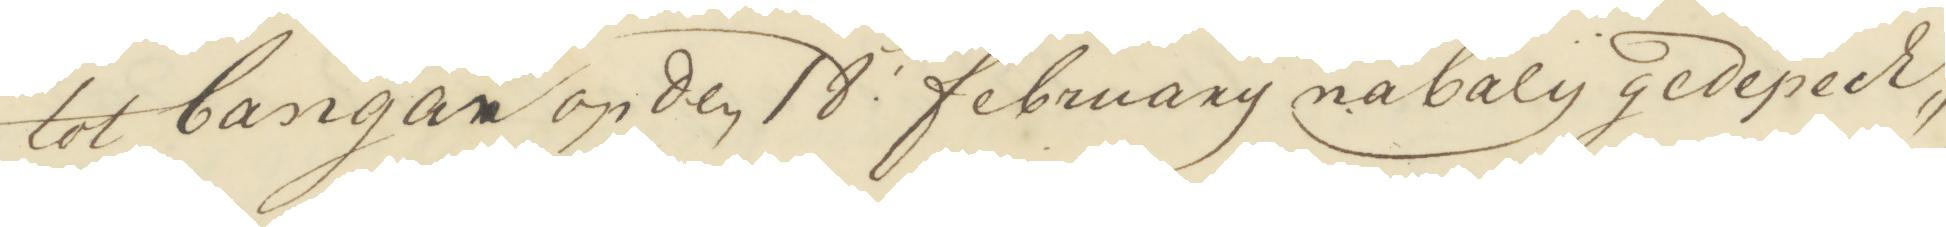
tot bangan op den 18:e februarij na balij gedepech„d
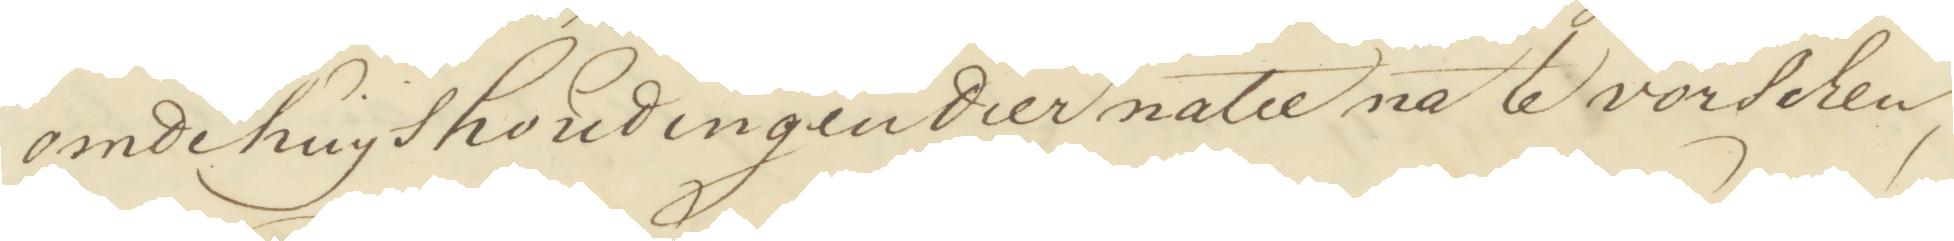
omde huijshoudingen dier natie na te vorschen,
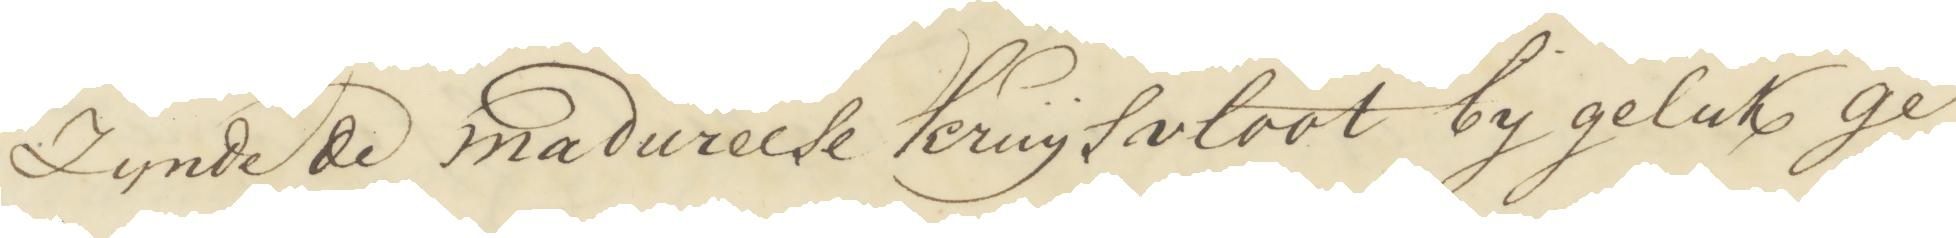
zijnde de madureese kruijsvloot bij geluk ge
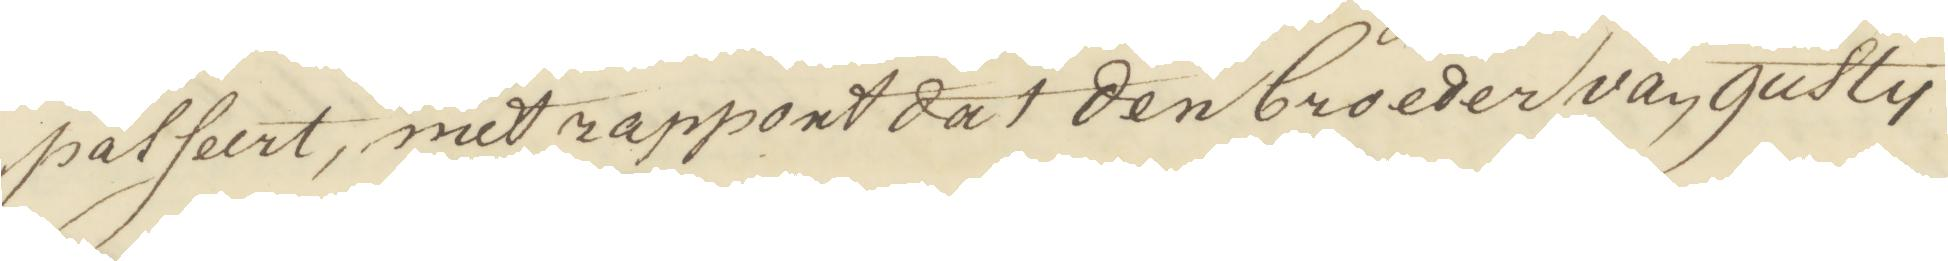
passeert, met rapport dat den broeder van gusty
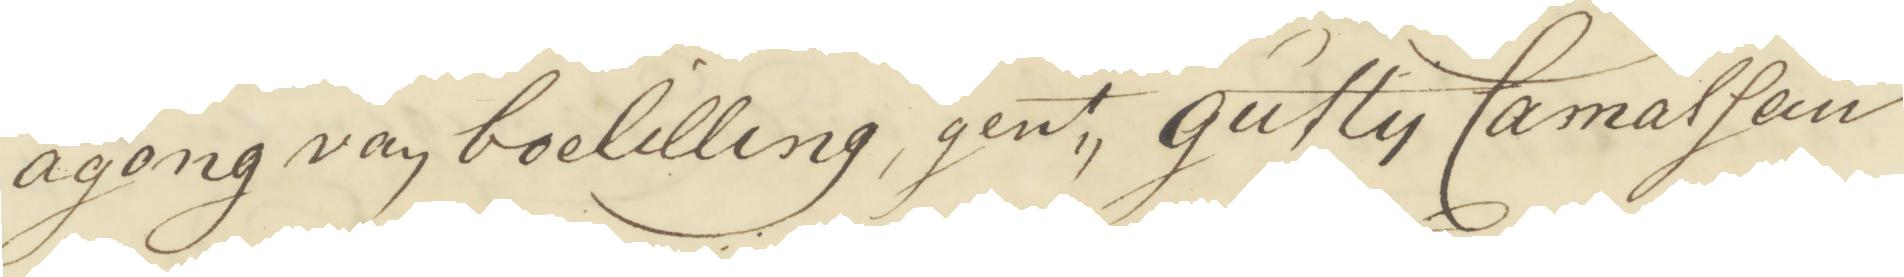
agong van boelilling, gen„t gusty Camassan
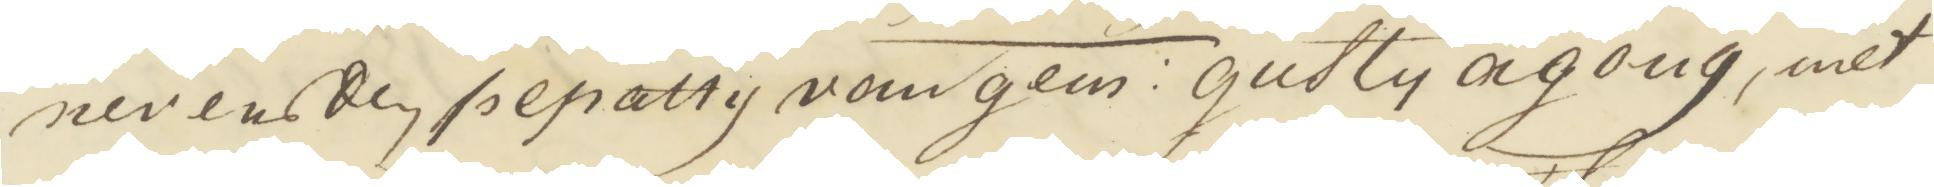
nevens den pepattij van gem: gusty agong, met
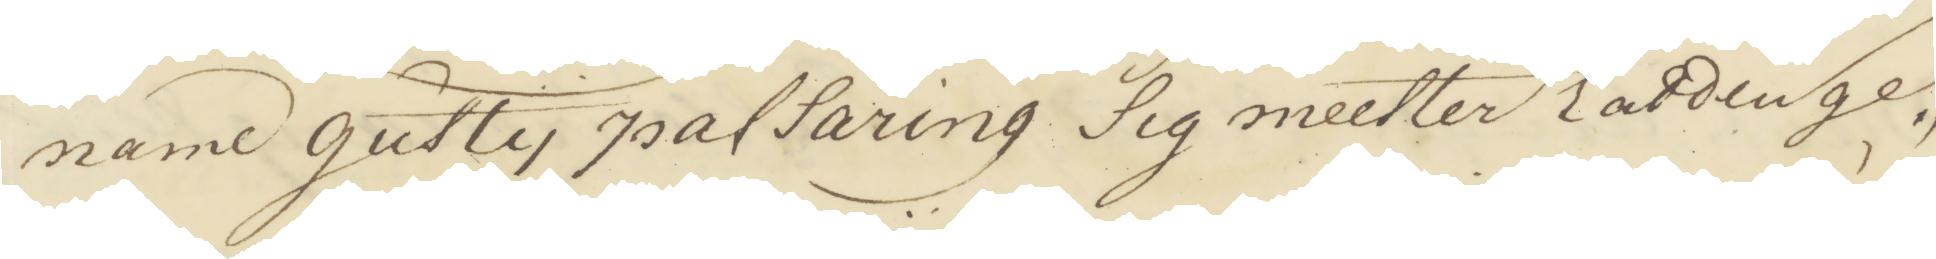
name gustij passaring sig meester hadden ge
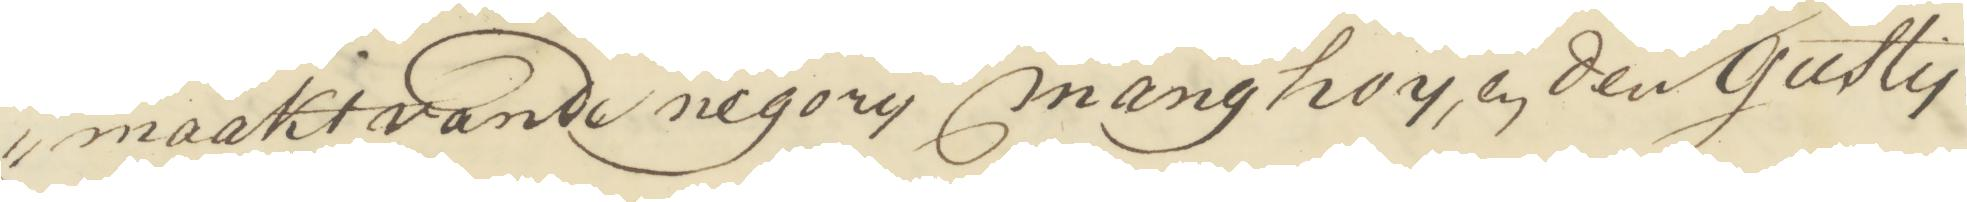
„maakt vande negorij manghoij, en den gustij
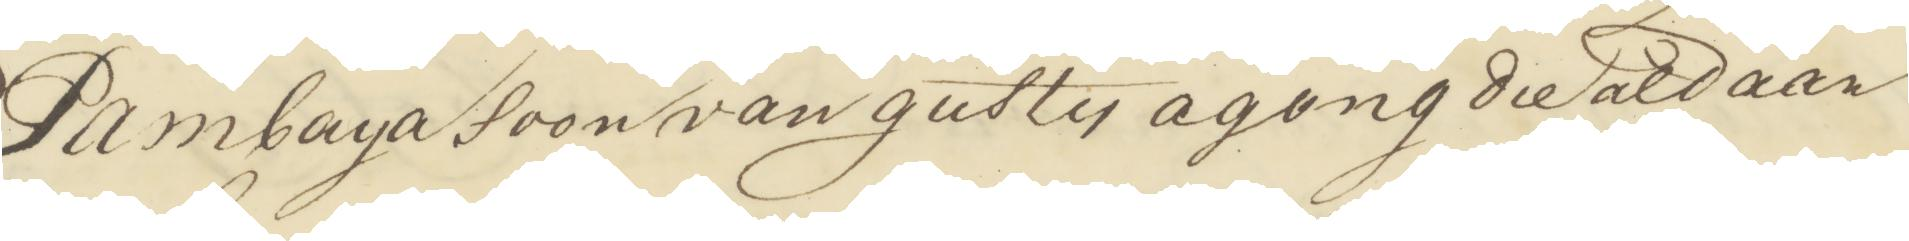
Pambaija soon van gustij agong die aldaar
